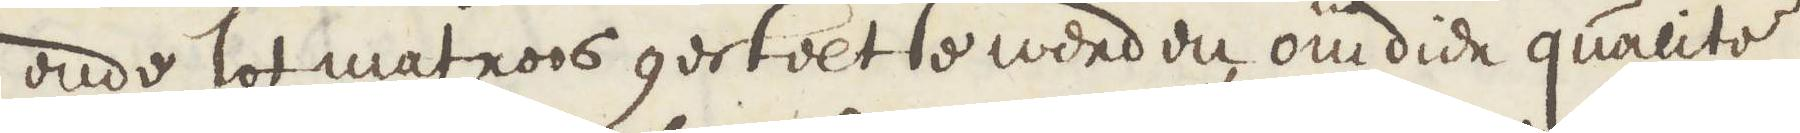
ende tot matroos gestelt te werden, om dier qualite
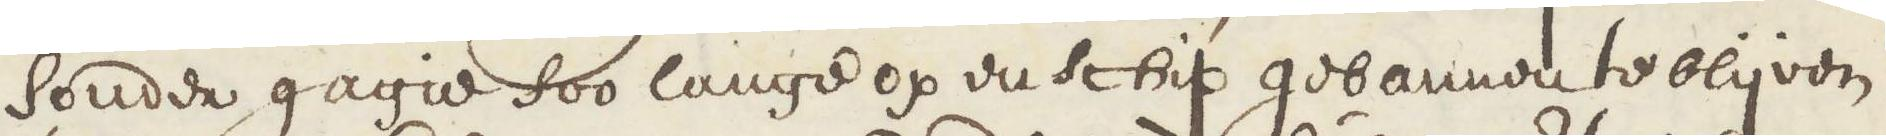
sonder gagie soo lange op en schip gebannen te blijven
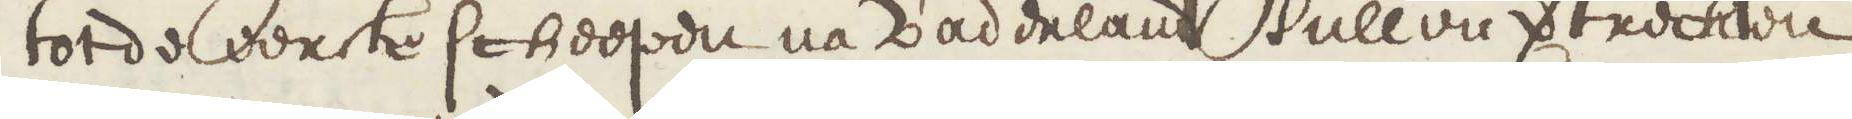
tot de eerste scheepen na vaderland sullen vertrecken
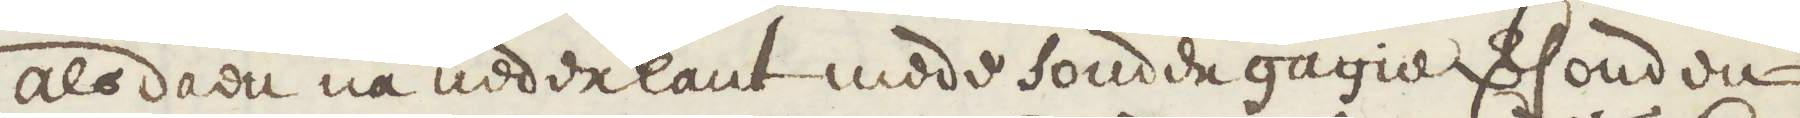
als daen na nederlant mede sonder gagie versonden
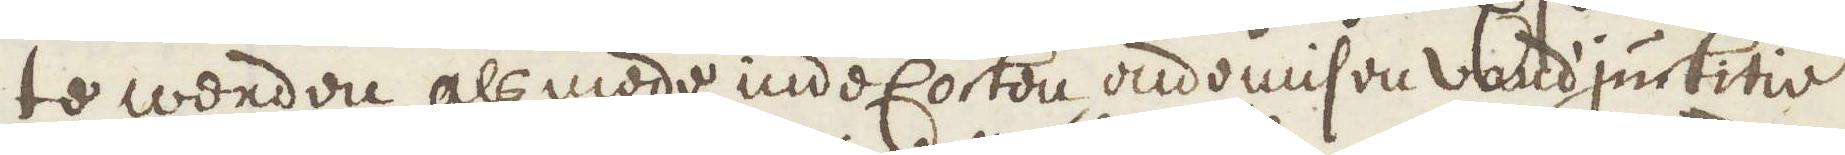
te werden als mede inde Costen ende misen vand' justitie
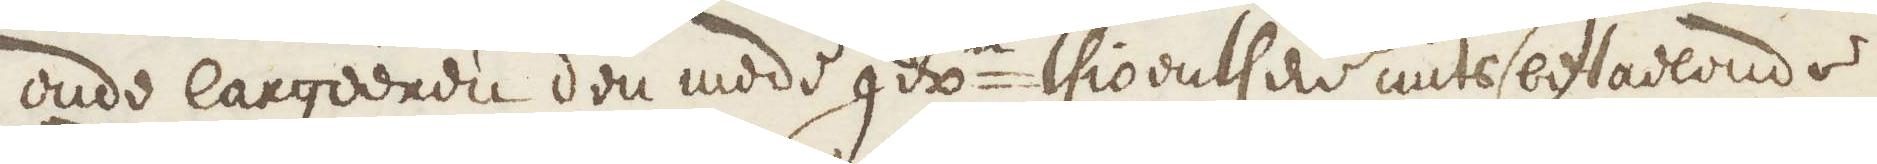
ende largeeren den mede gev=n tsioentsche mits betaelende
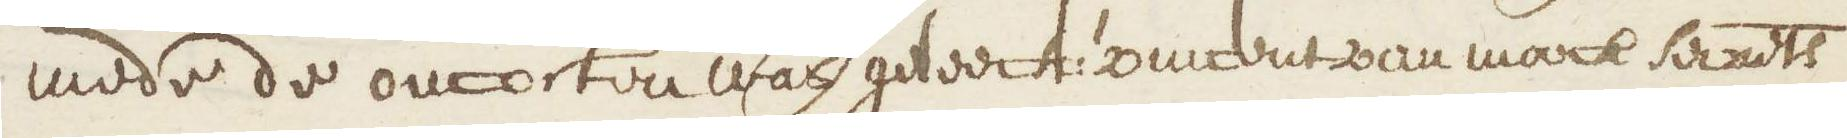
mede de oncosten was geteeck: 'vincent van moock secrts
